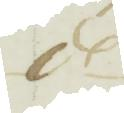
d_o
